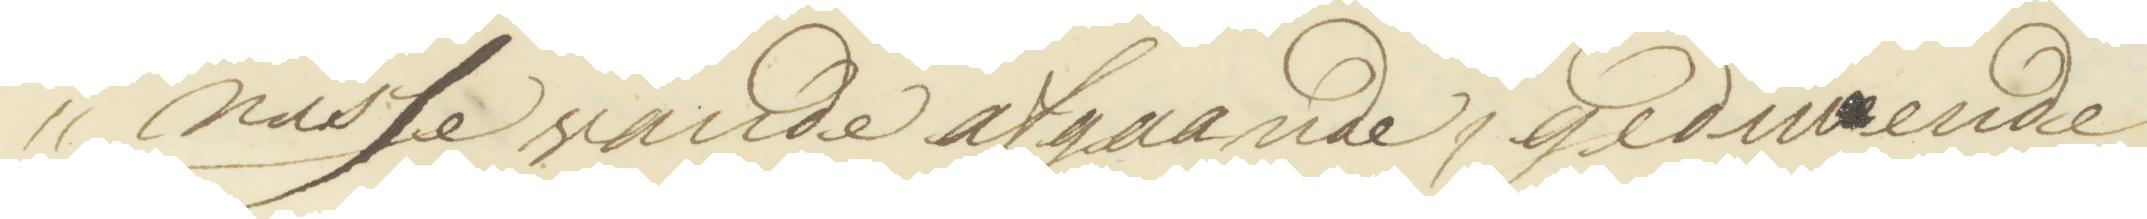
„nisse vande afgaande, gedurende
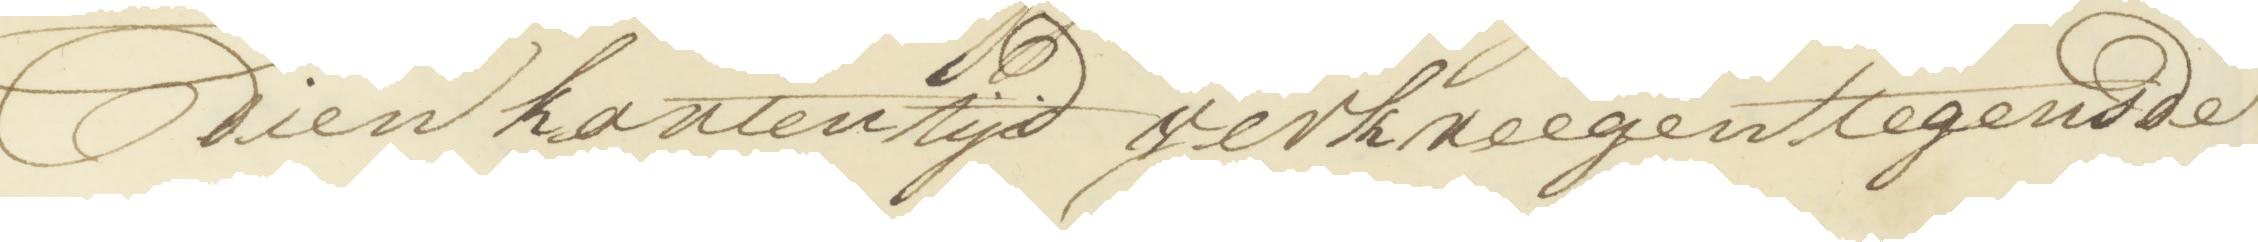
dien korten tijd verkreegen tegens de
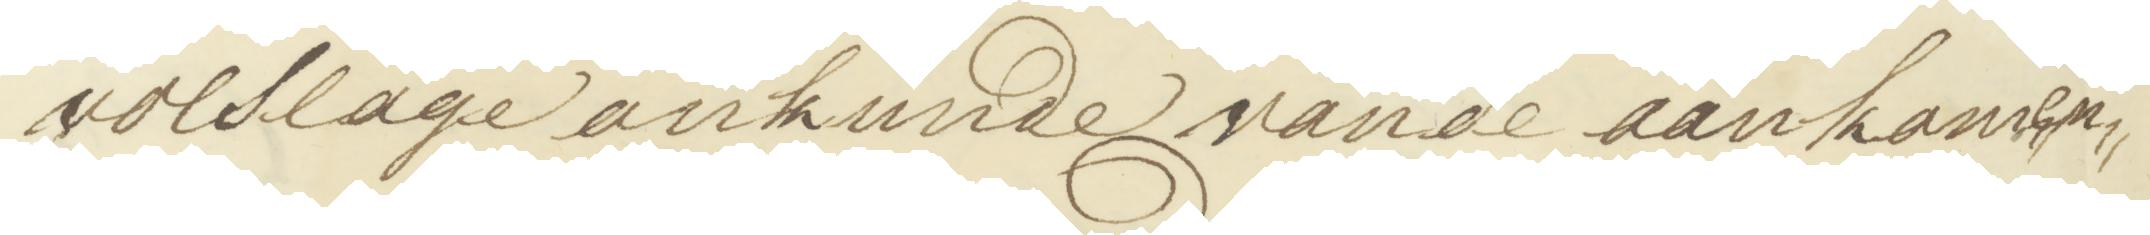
volslage onkunde van de aankomen„
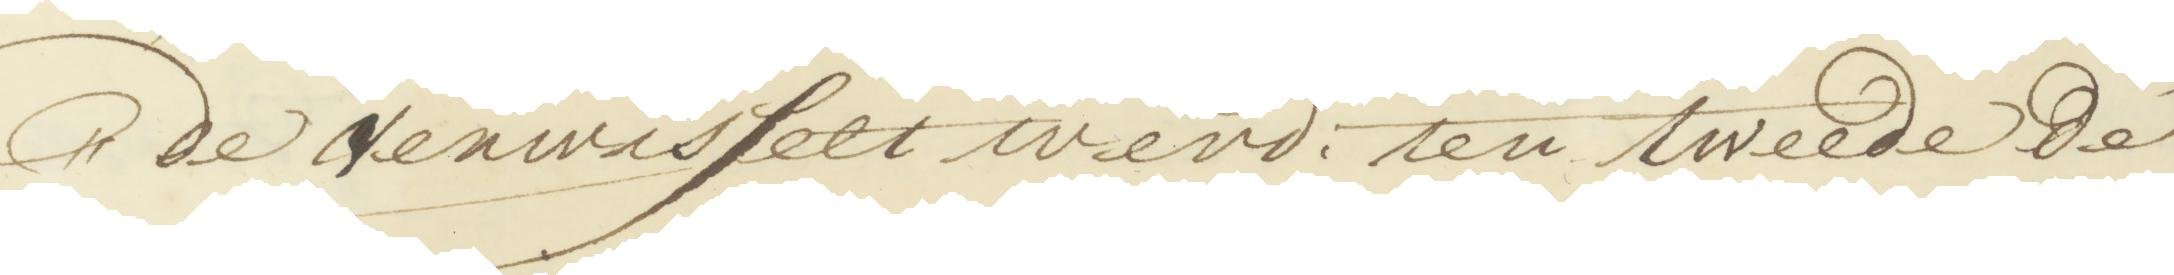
de verwisselt werd: ten tweede de
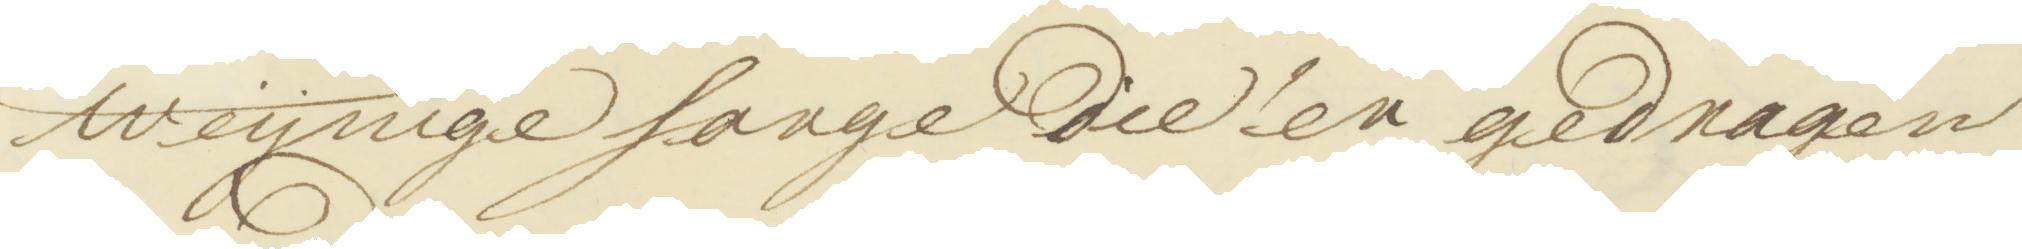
weijnige sorge die 'er gedragen
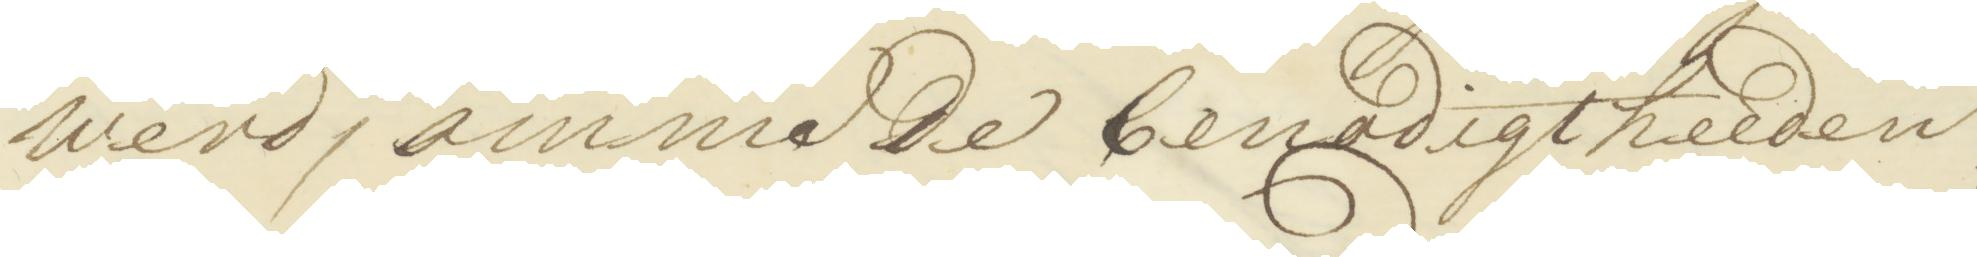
werd, omme de benodigtheeden
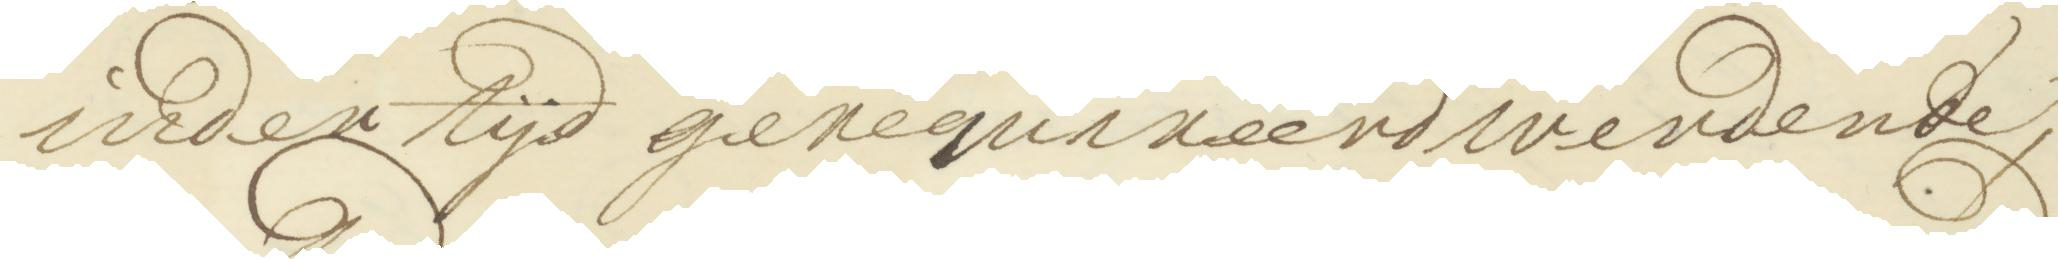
inder tijd gerequireerd werdende,
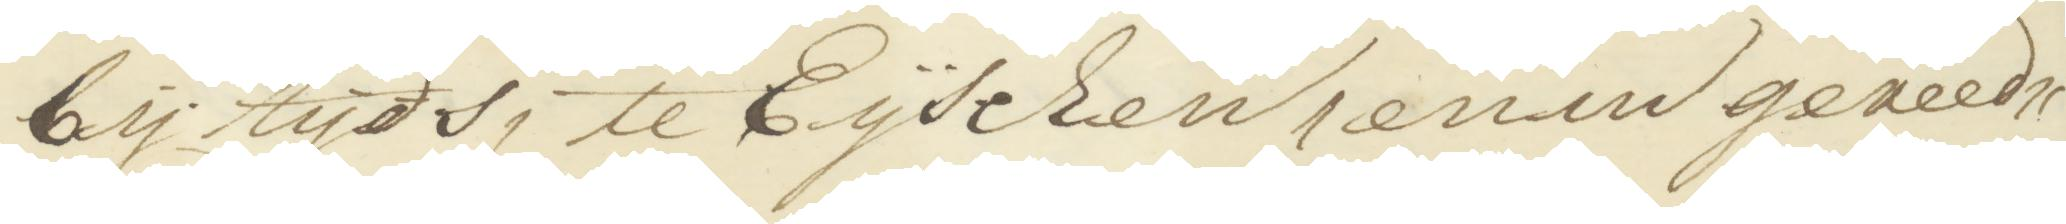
bij tijds, te Eijschen, en in gereed
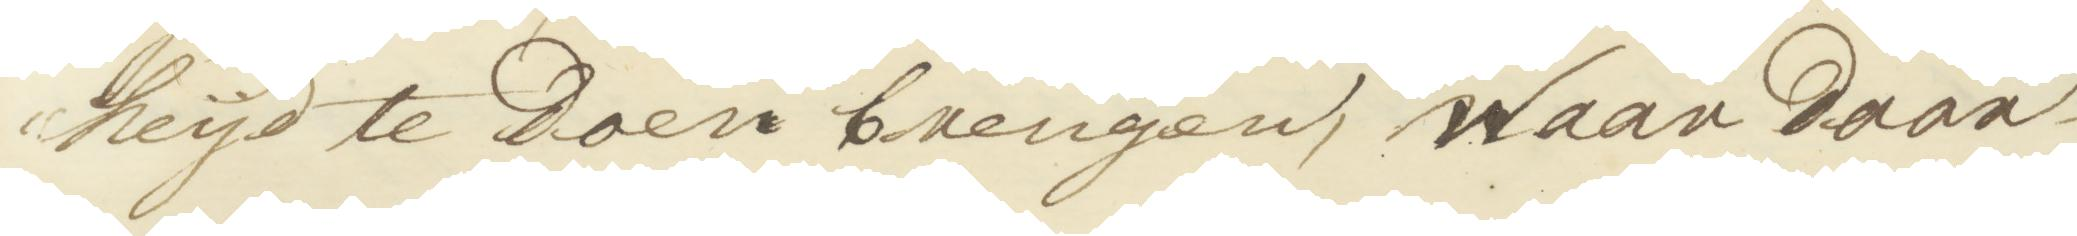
„heijd te doen brengen, waar door
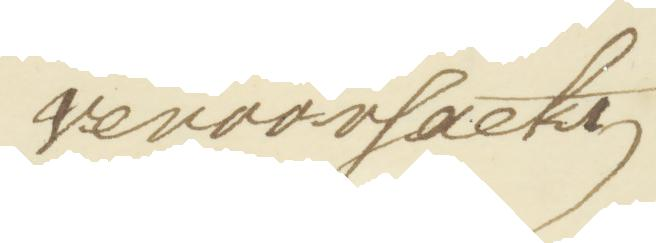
veroorsaekt
